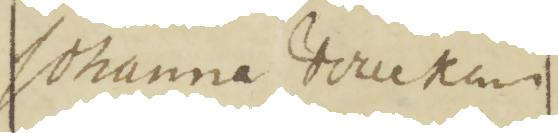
Johanna Vereeken
